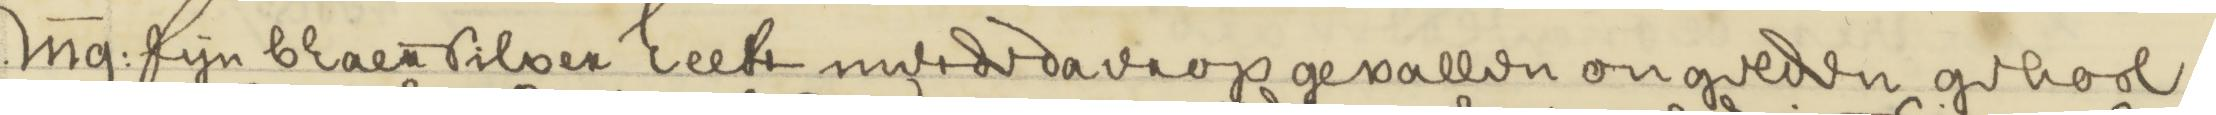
Mq: fijn bhaer silver heeft met de daerop gevallen ongelden gekost
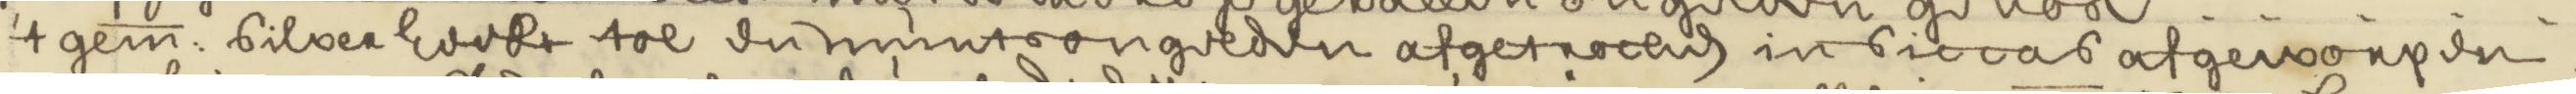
’t gem: silver heeft tol en muntsongelden afgetrocken in siccas afgeworpen
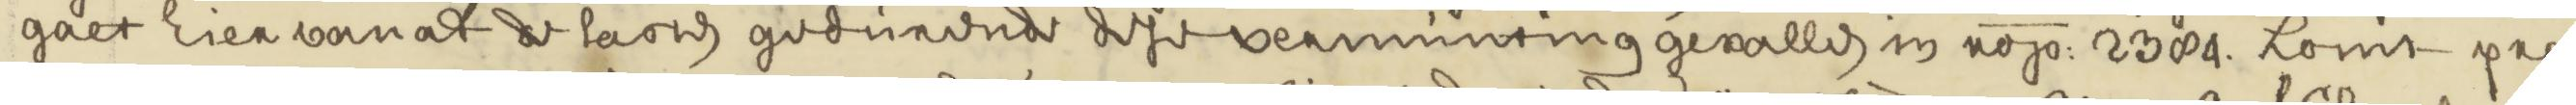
gaet hier vanaf de lasten gedurende dese vermunting gevallen in rop: 2384. komt pro
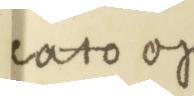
ato o
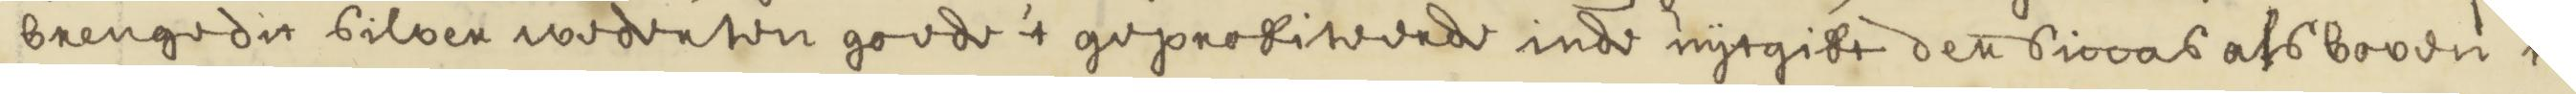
brenge dit silver weder ten goede ’t geprofiteerde inde uijtgift der siccas als boven is
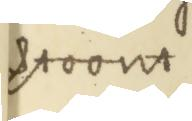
vertoont
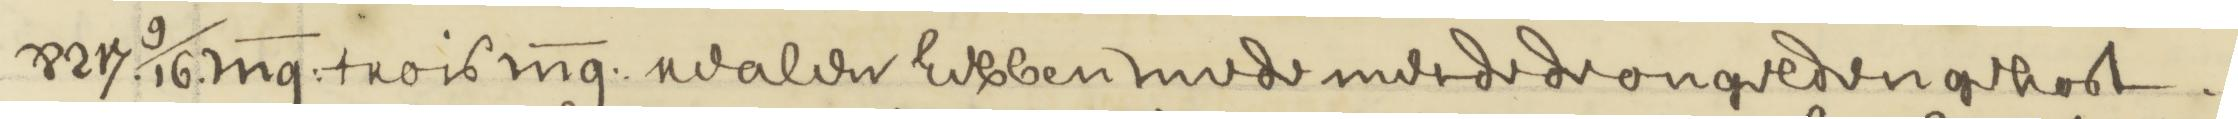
8217. 9/16. mq: trois mq: realen hebben mede met de de ongelden gekost.
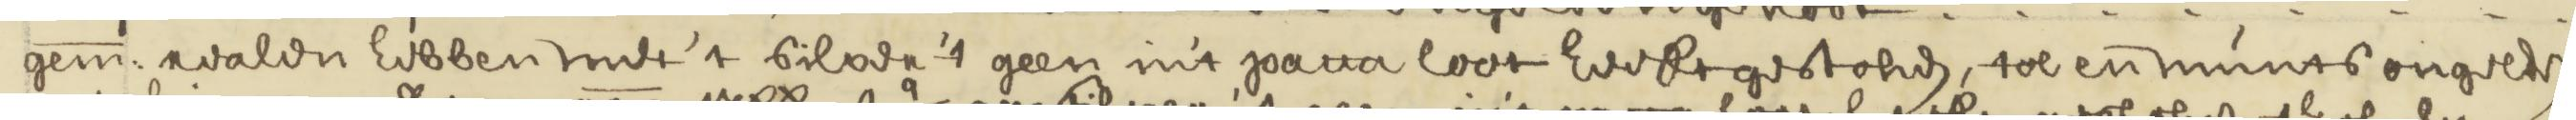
gem: realen hebben met ’t silver ’t geen in’t pacca loot heeft gestoken, toe en munts ongelden
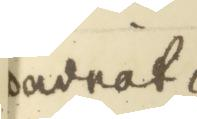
daeraf
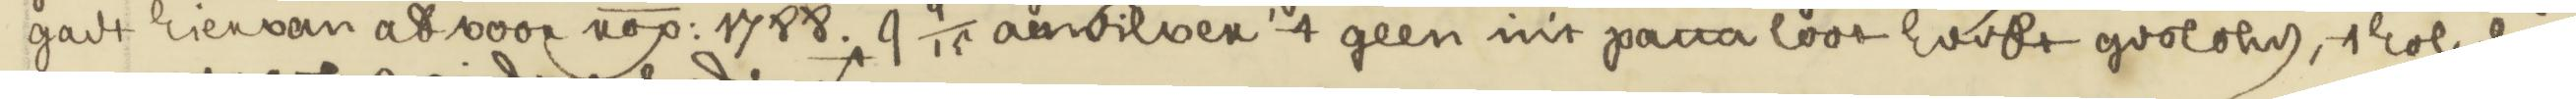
gaet hier van af voor rop: 1788. 1 9/15 om silver ’t geen in’t pacca loot heeft gestoken, thol en
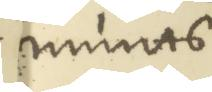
munts
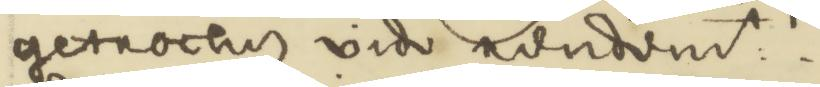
getrocken vid rendem:t
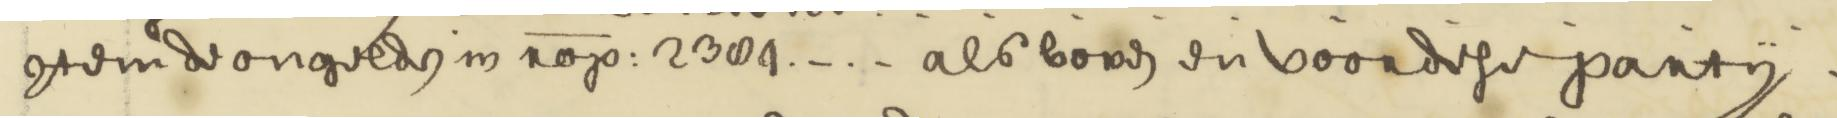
jtem de ongelden in rop: 2384 . - . - als boven en voor dese partij
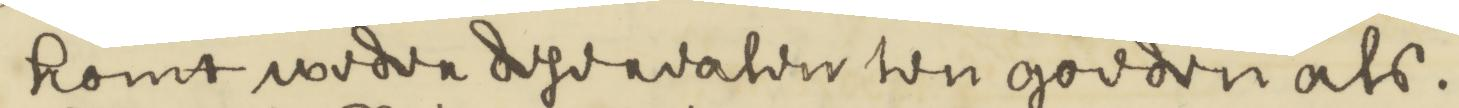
komt weder dese realen ten goeden als.
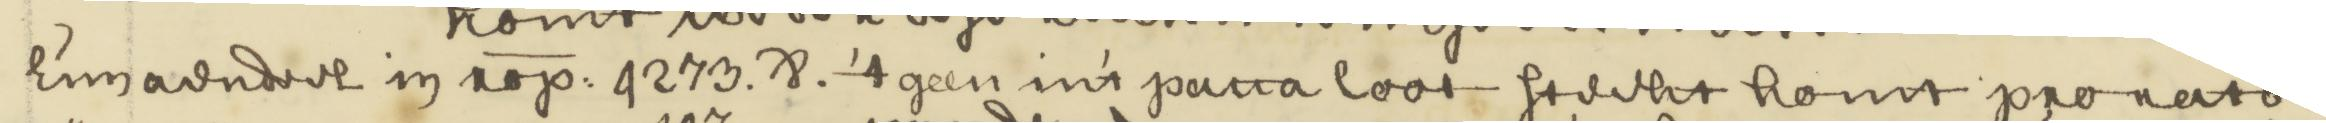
hun aendeel in rop: 4273. 8. ’t geen in't pacca loot steekt komt pro rato
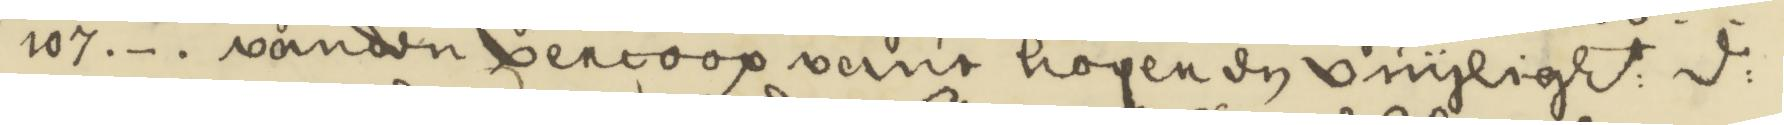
107 . – . van den vercoop van't koper en vuijligh:t _:o
